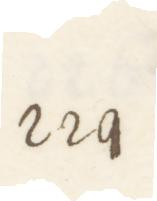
224
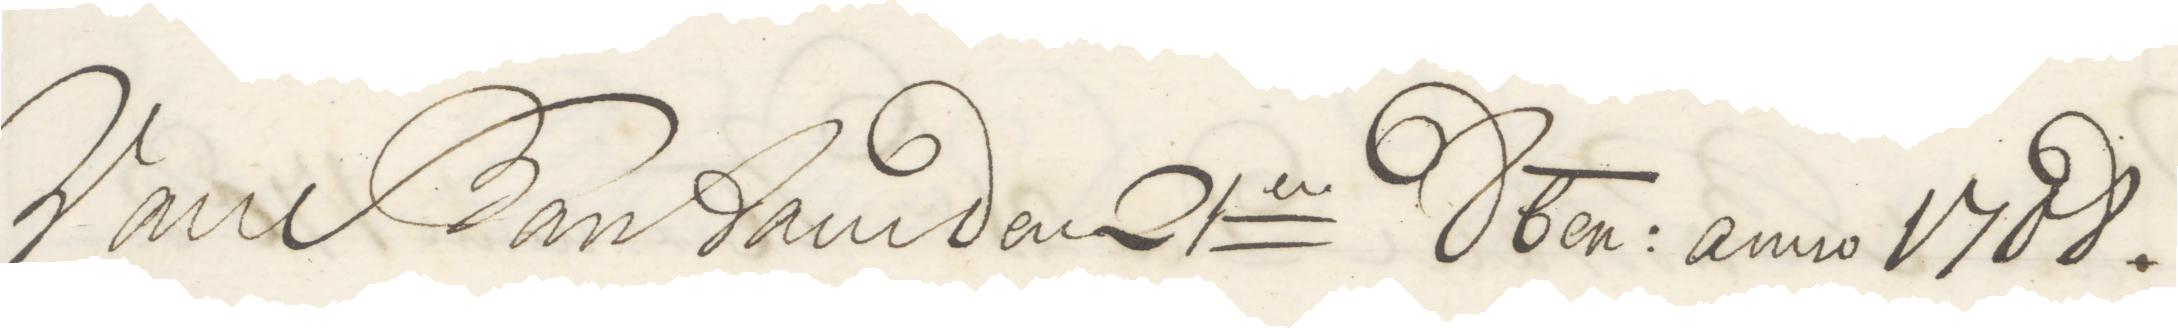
Van Bantam den 21=en 8ber: anno 1708.
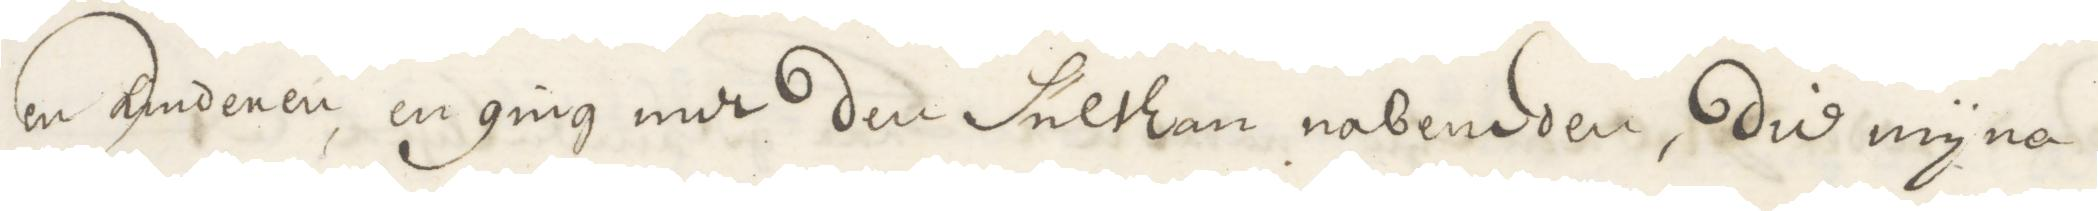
en kinderen, en ging met den sulthan nabeneden, die mij na
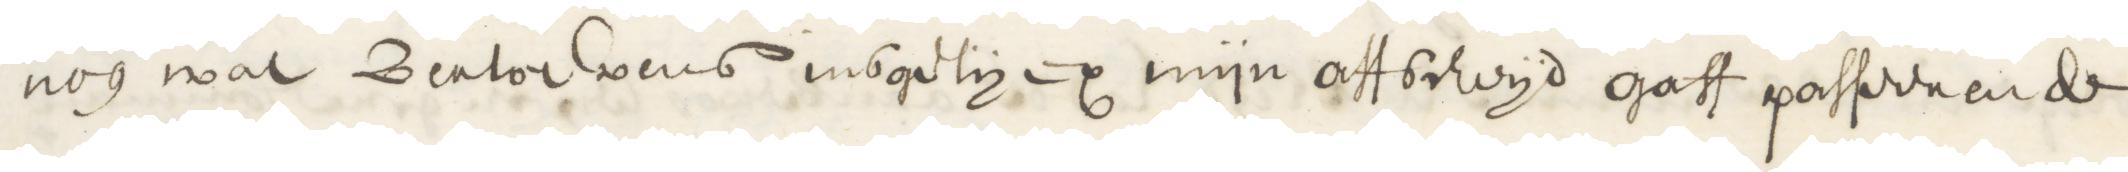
nog wat Vertoevens insgelijcx mijn affscheijd gaff passeerende
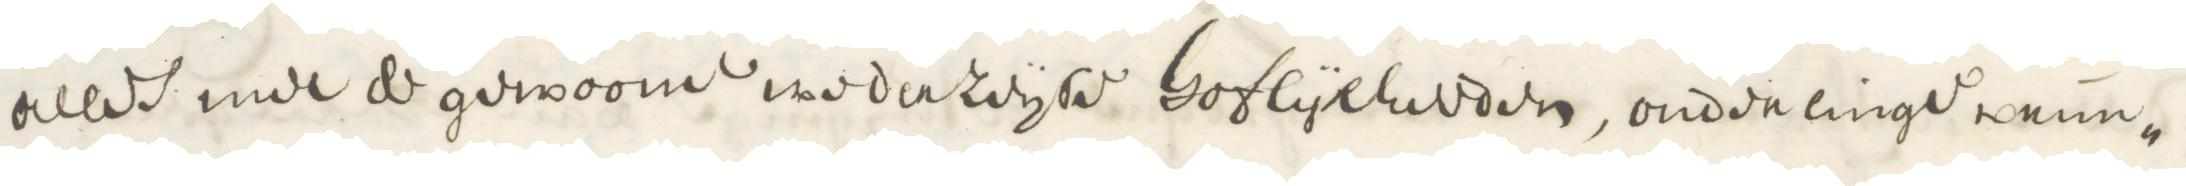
alles met de gewoone wederzeijse Hoflijkheeden, onderlinge vrun„
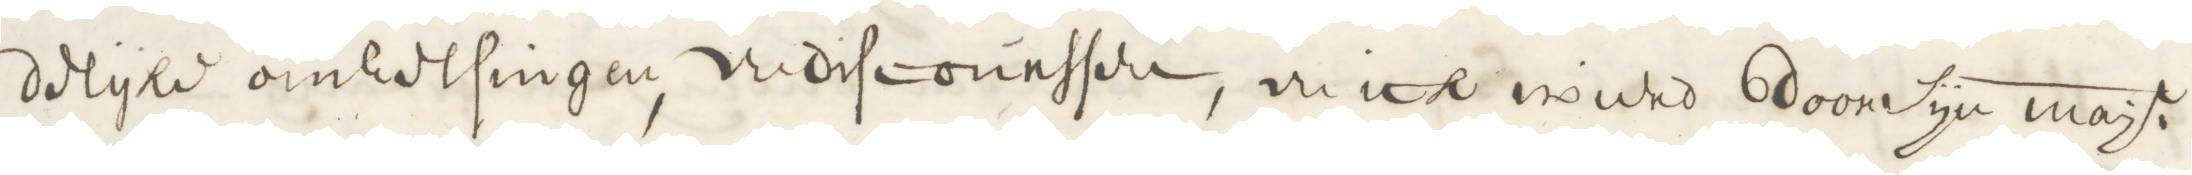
delijke omhelsingen, en discourssen, en ick wierd door sijn maj.
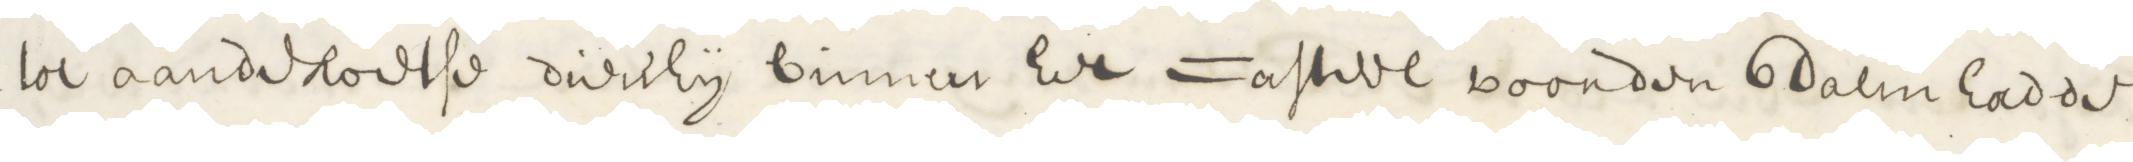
tot aandekoetse dienhij binnen het casteel voor den dalm hadde
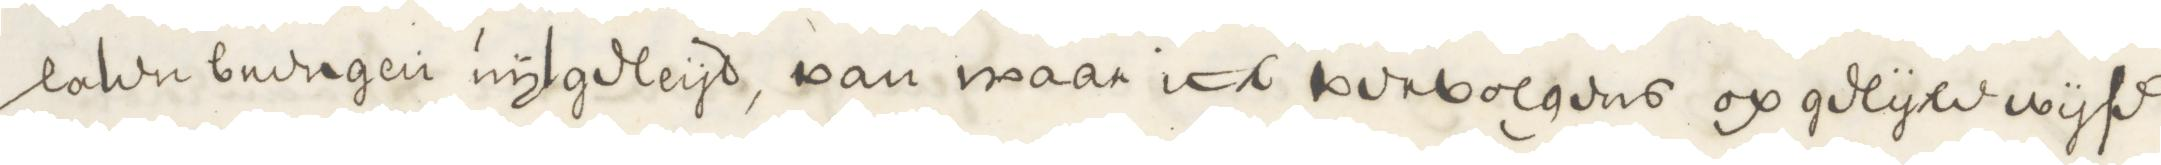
laten brengen uijtgeleijd, van waar ick vervolgens op gelijke wijse
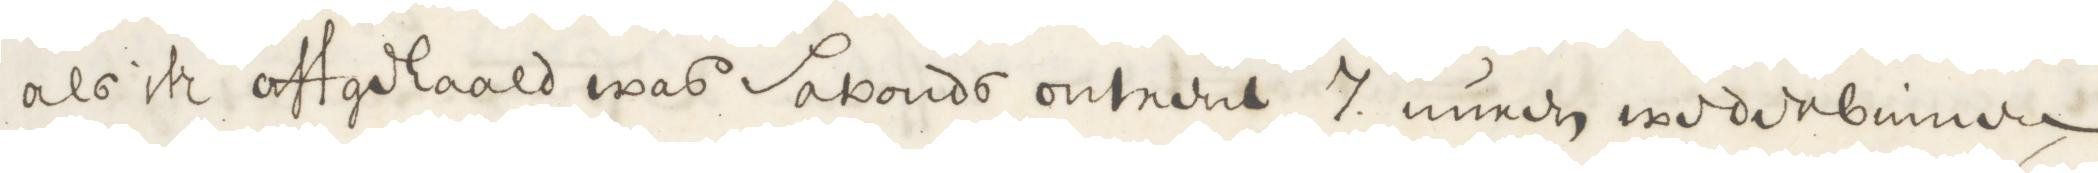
als ik affgehaald was savonds ontrent 7. uuren weder binnen
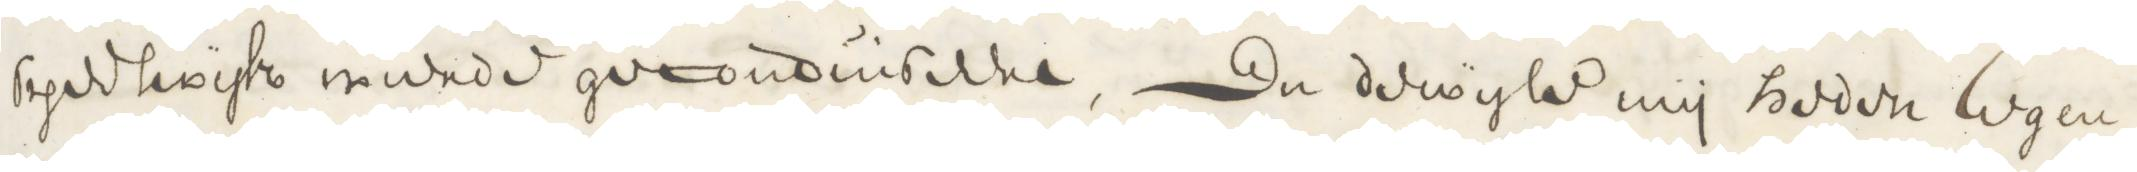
speelwijk wierde geconduiseert, En dewijle mij heden tegen
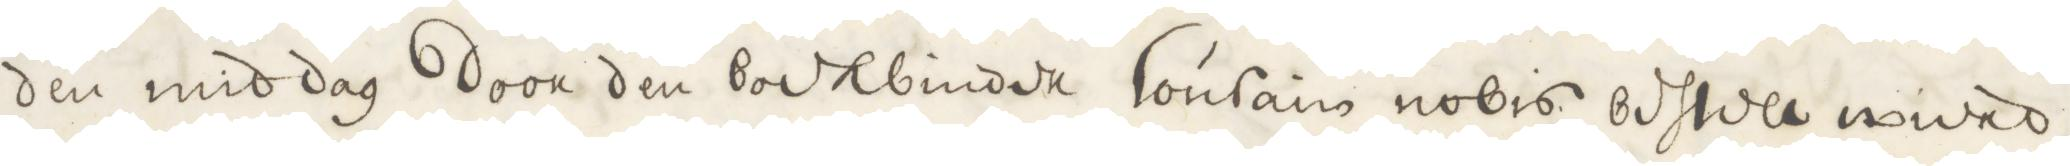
den middag door den boekbinder tousain nobis bestelt wierd
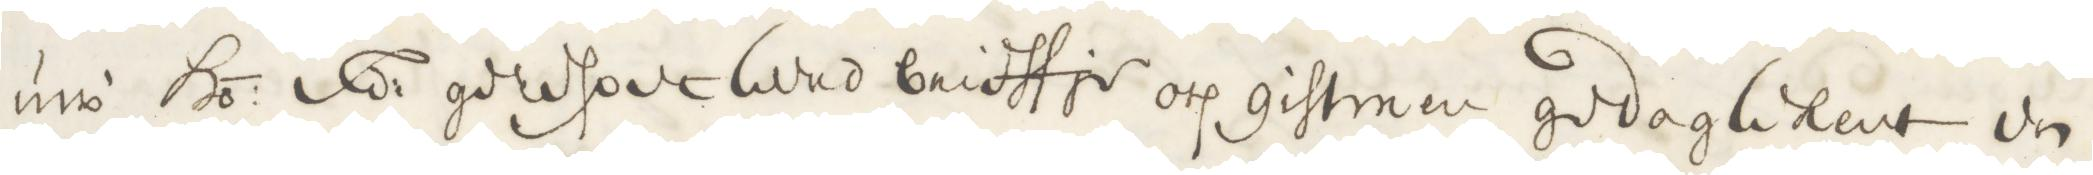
uw Ho: Ed: gerespecteerd brieffje op gisteren gedagtekent en
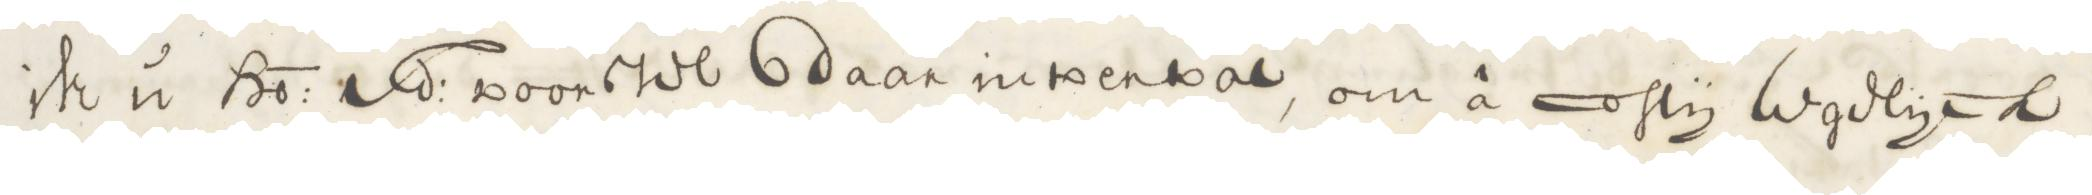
ik u Ho: Ed: voorstel daar in vervat, om â costij tegelijck
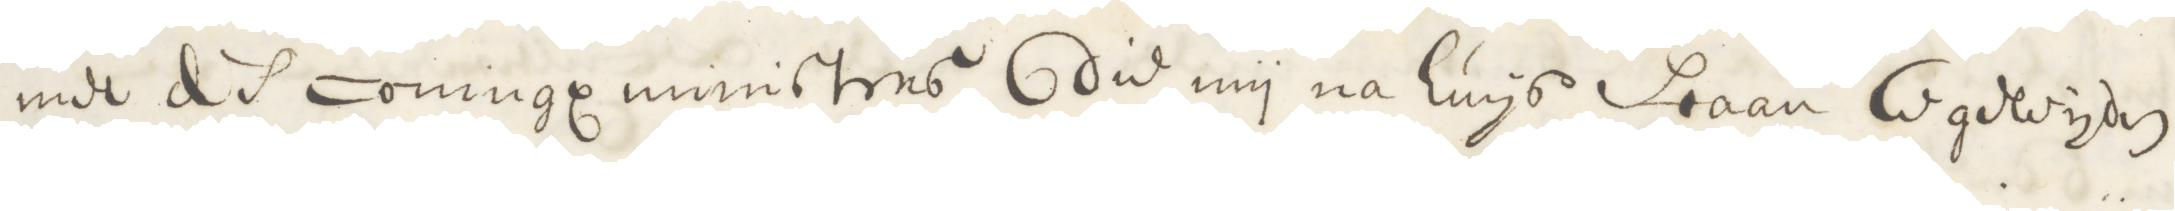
met des coningx ministers, die mij na huijs staan te geleijden
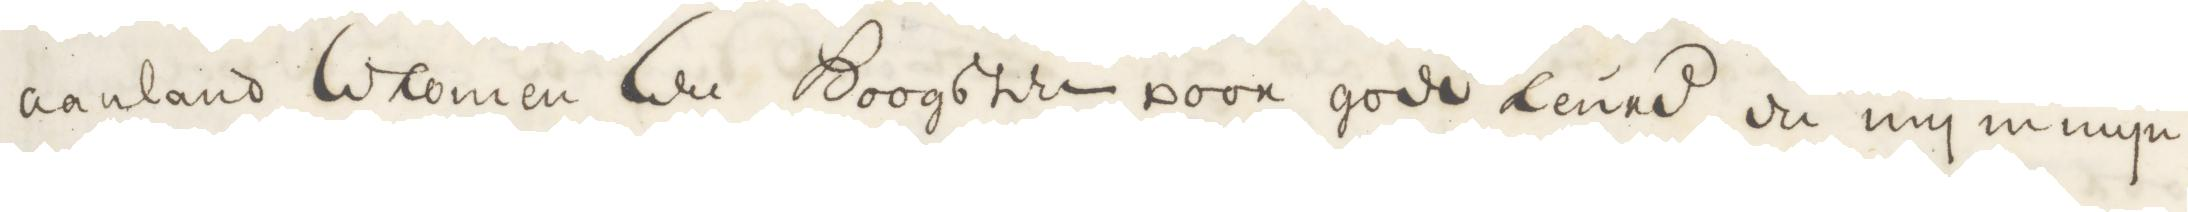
aan land te komen ten Hoogsten voor goet keure, en mij in mijn
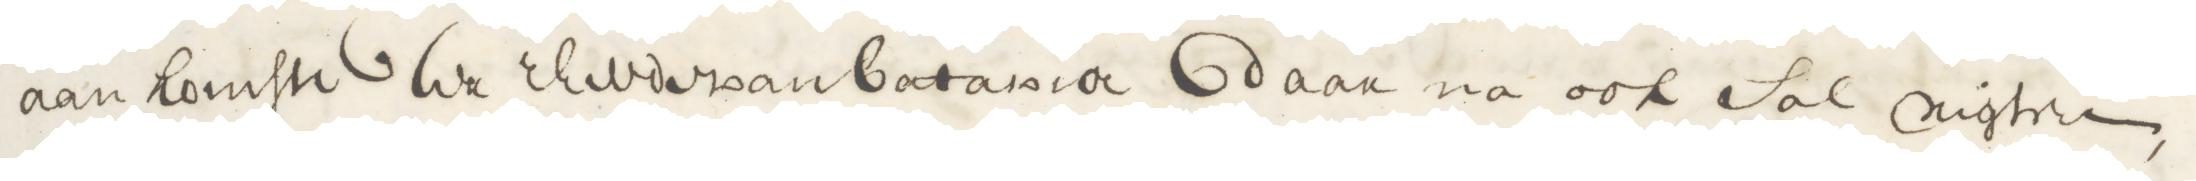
aan komste ter rheede van batavia daar na ook sal rigten,
